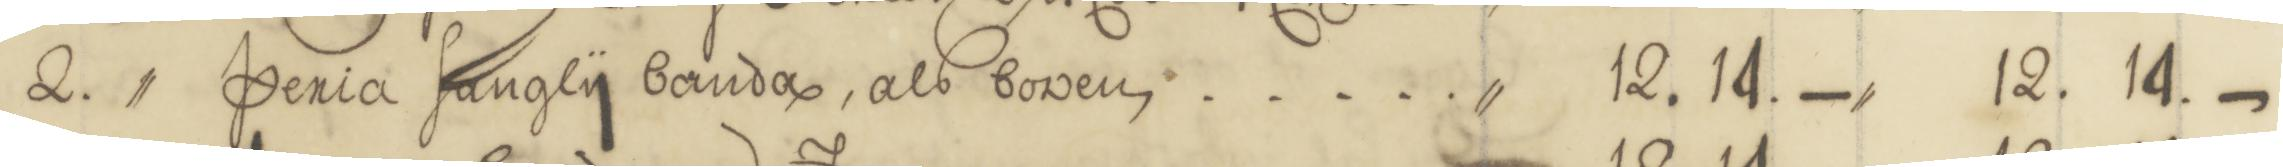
2. „ Peria sanglij banda, als boven - - - - - „ 12. 14. —„ 12. 14. —
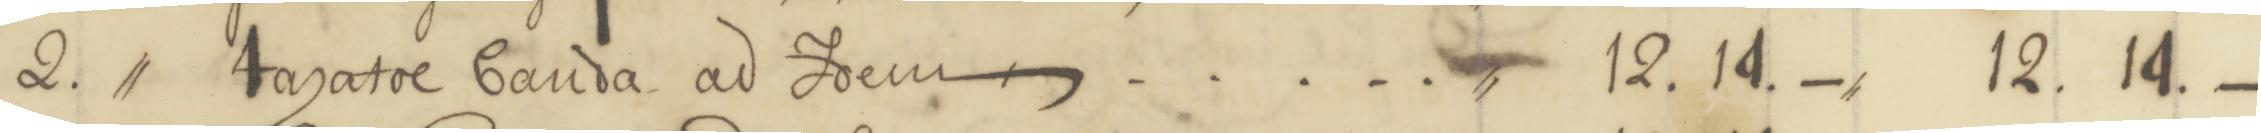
2. „ tajatoe banda ad Idem - - - - - „ 12. 14. —„ 12. 14. —
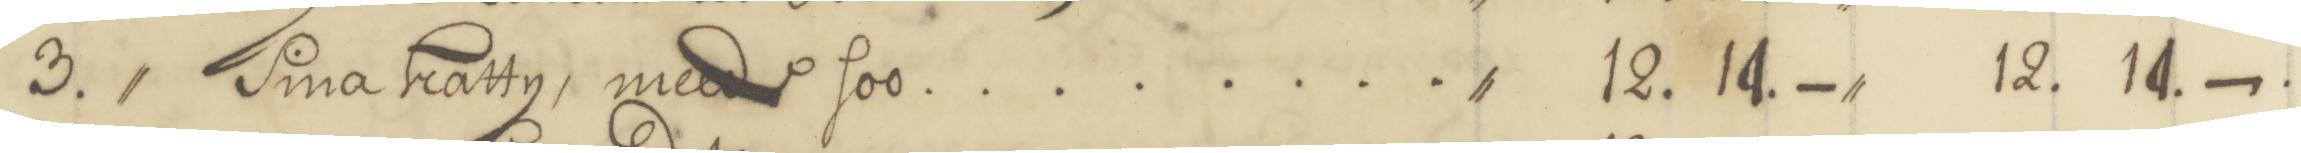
3. „ Sina katty, meede soo - - - - - - - - „ 12. 14. —„ 12. 14. —.
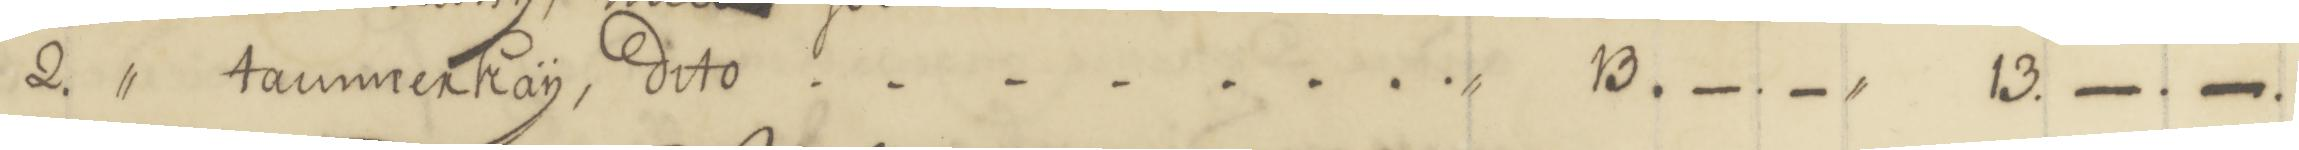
2. „ tammerkaij, dito - - - - - - - - „ 13. —. — „ 13. —. —.
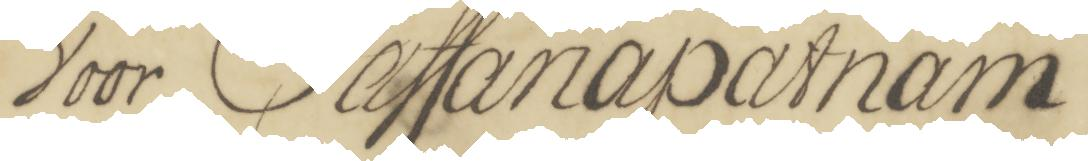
Voor Iaffanapatnam
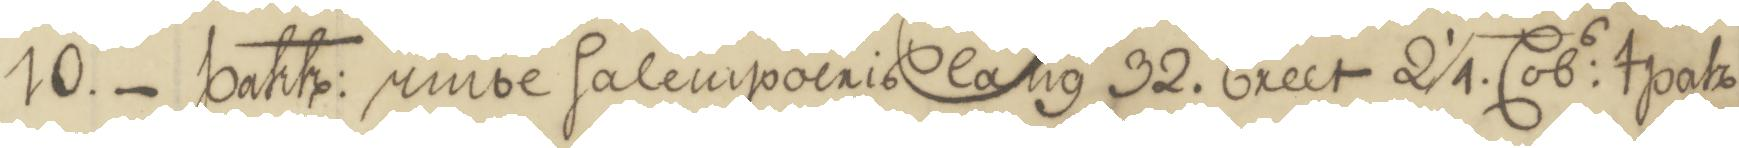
10. — pakk: ruwe salempoeris lang 32. breet 2¼. Cob:s t pak
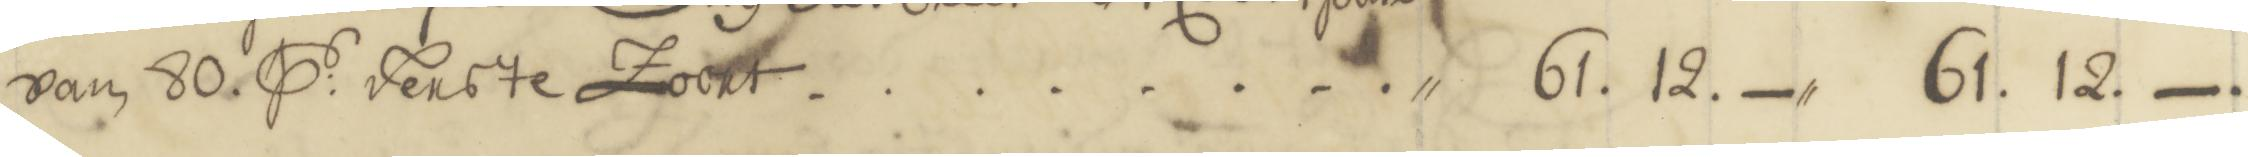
van 80. p:s Eerste Zoort - - - - - - - - „ 61. 12. —„ 61. 12. —.
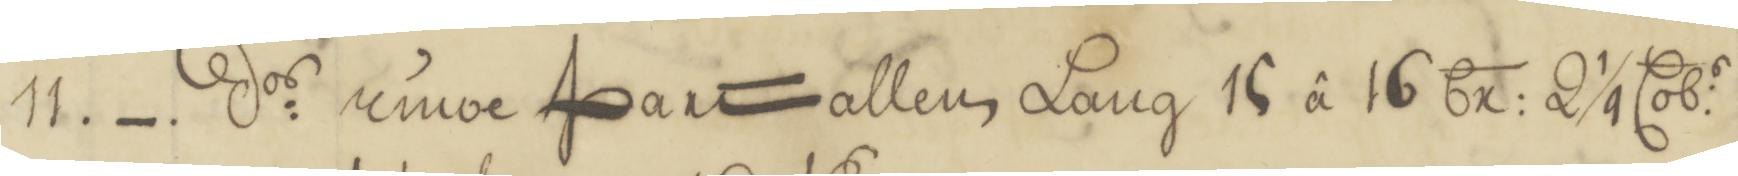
11. —. d:os ruwe Parcallen Lang 15 â 16 br: 2¼ Cob:s
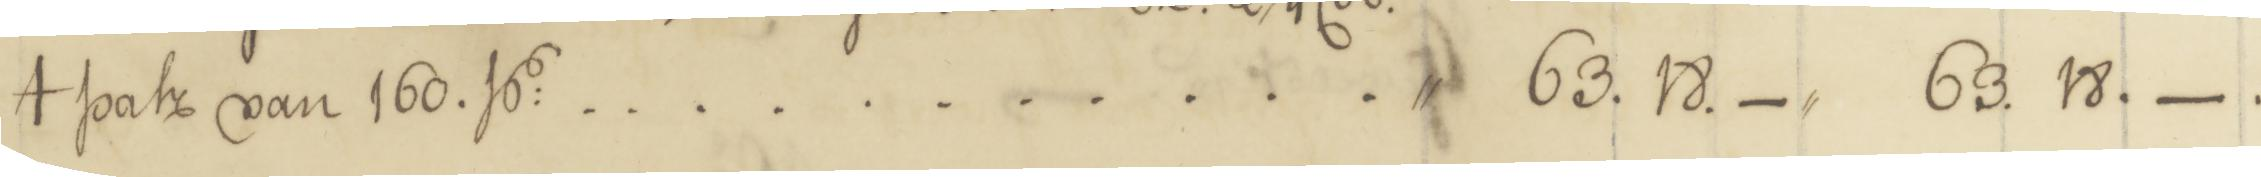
t pak van 160. p:s - - - - - - - - - - - „ 63. 18. —„ 63. 18. —.
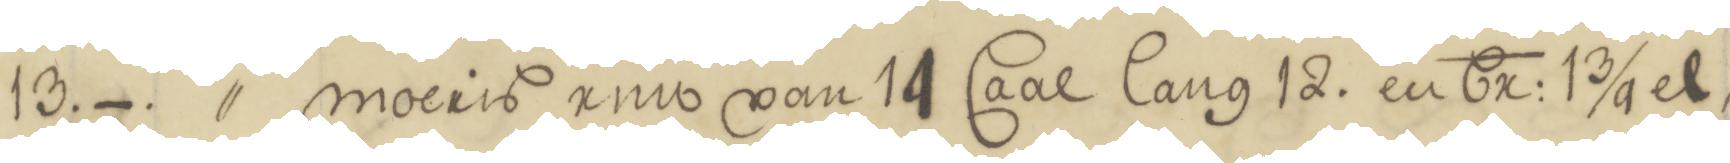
13. —. „ moeris ruw van 14 Caal lang 12. en br: 1¾ el
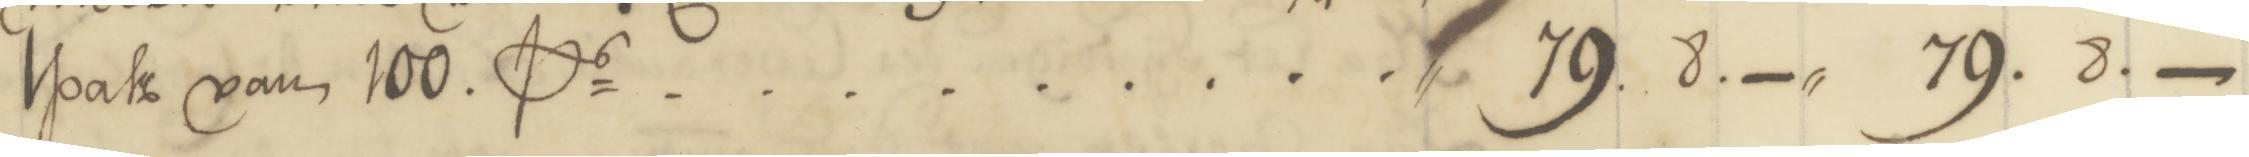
1 pak van 100. P=s - - - - - - - - - „ 79. 8. —„ 79. 8. —
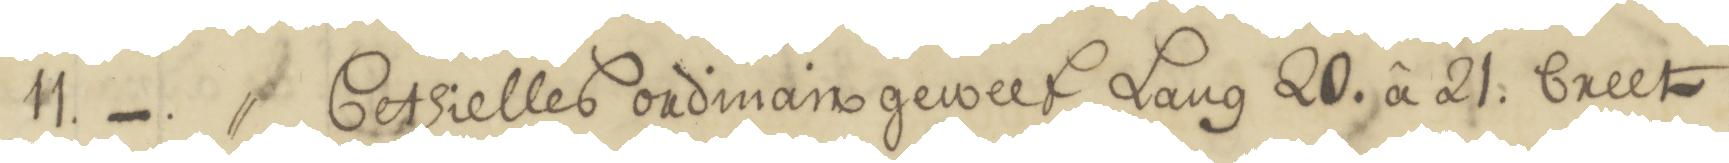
11. —. „ bethielles ordinair geweef Lang 20. â 21. breet
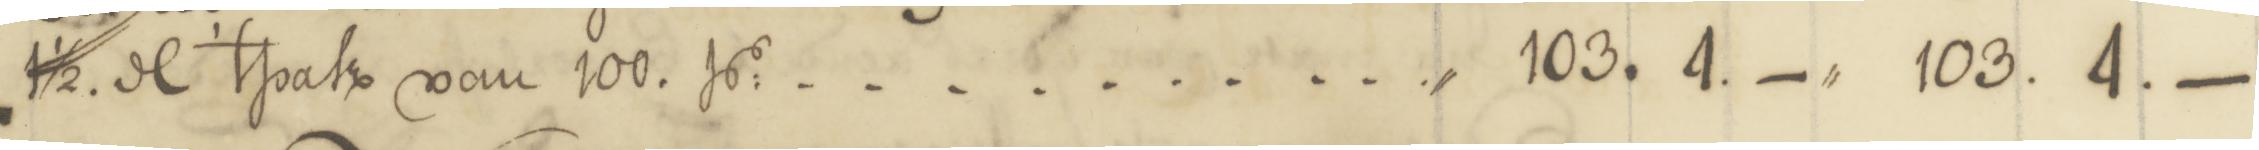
1½. el 'tpak van 100. p:s - - - - - - - - - - „ 103. 4. —„ 103. 4. —
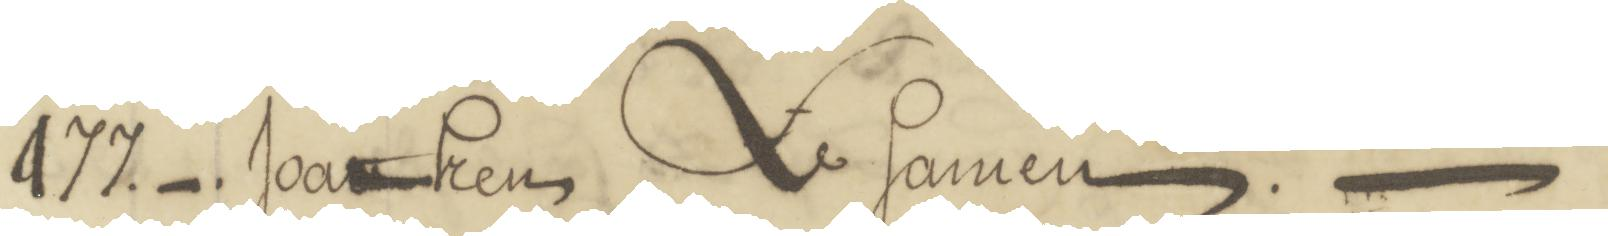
477. —. Packen Te samen. —
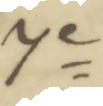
7=e
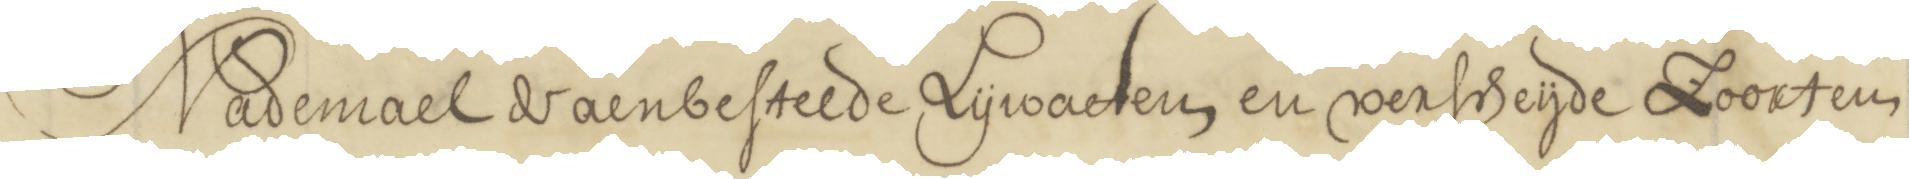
Nademael de aenbesteede Lijwaeten en verscheijde Zoorten
